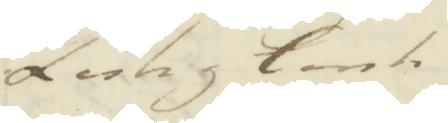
Zestig Cent
